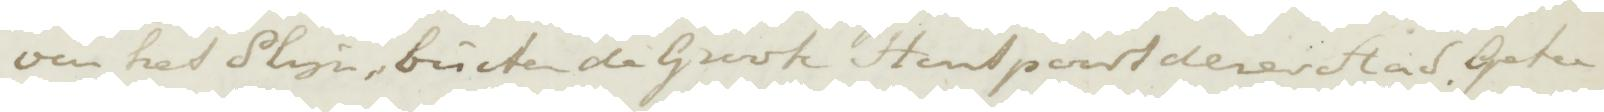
van het Plijn, buiten de Groote Houtpoort dezer Stad, getee
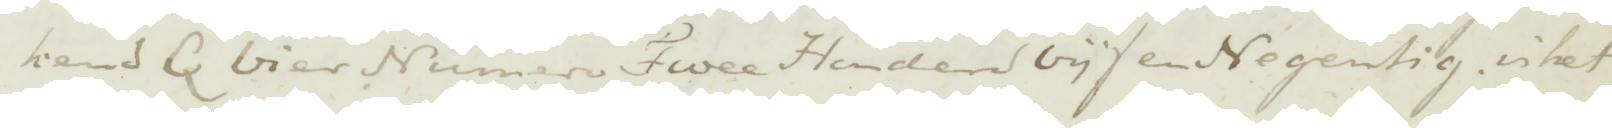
=kend Q vier Numero Twee Honderd vijfen Negentig, is het
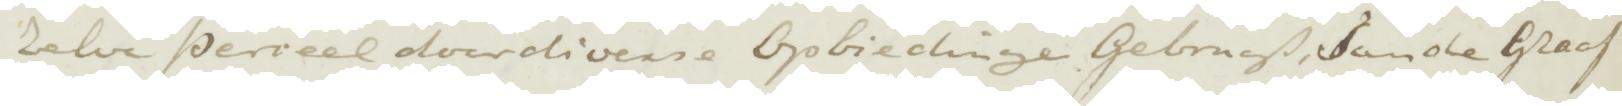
zelve perceel door diverse Opbiedinge gebragt, Jan de Graaf
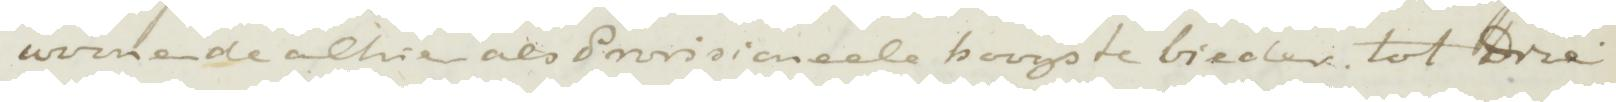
woonende alhier als Provisioneele hoogste bieder, tot Drie
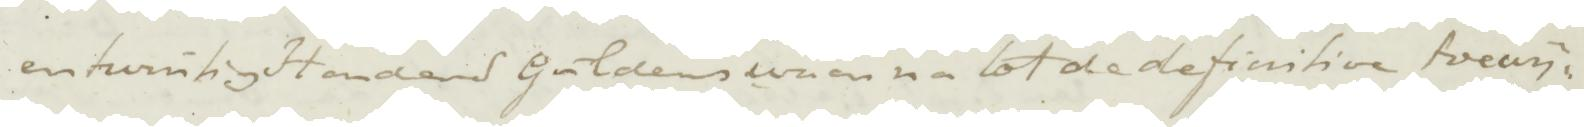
en twintig Honderd Guldens waar na tot de definitive toewij=
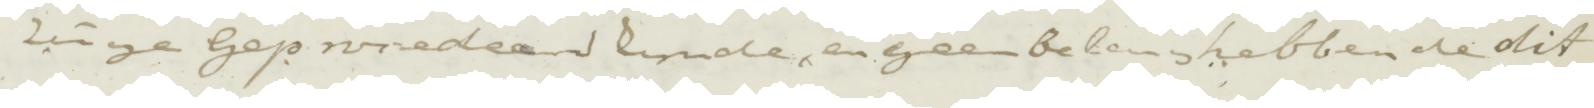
zinge Geprocedeerd zynde, en geen belang hebbende dit
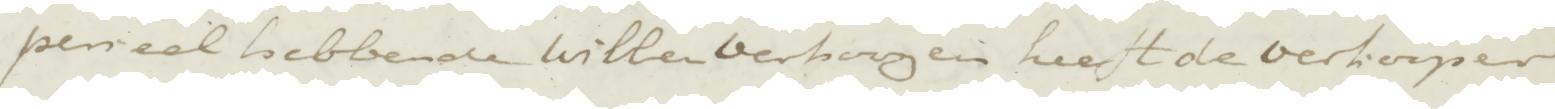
perceel hebbende willen verhogen en heeft de verkooper
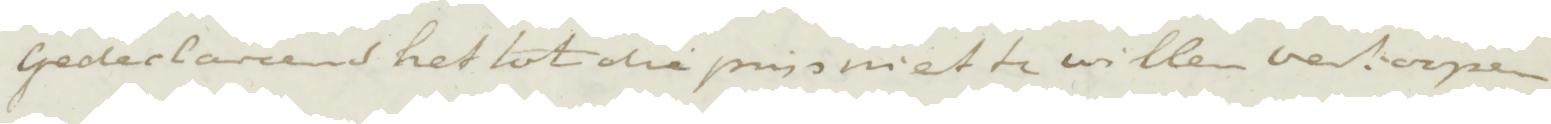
gedeclareerd het tot die prijs niet willen verkoopen
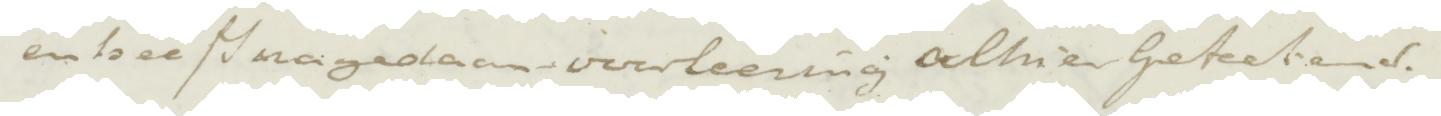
en heeft nagedaane voorleezing alhier geteekend.
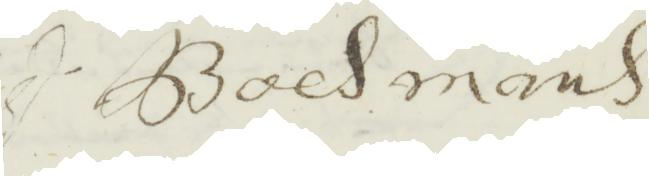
W: Boesmans
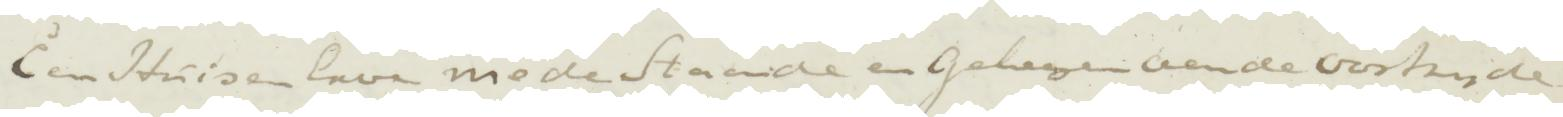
Een Huise Erve mede Staande en gelegen aan de oostzyde
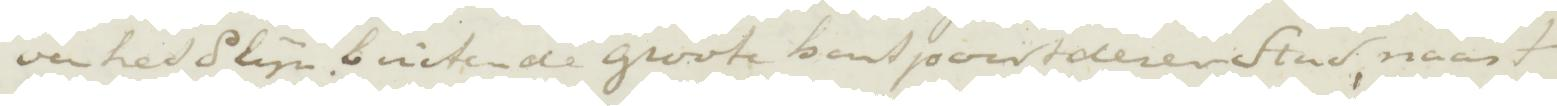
van het Plijn buiten de groote houtpoort dezer stad, naast
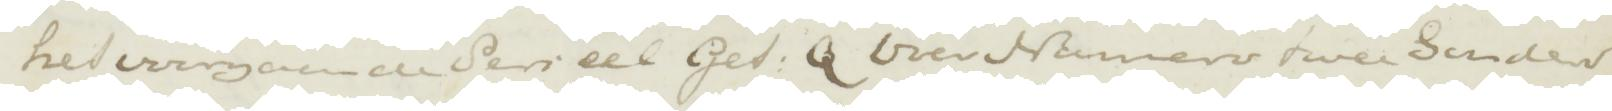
het voorgaande Perceel get: Q vier Numero twee honderd
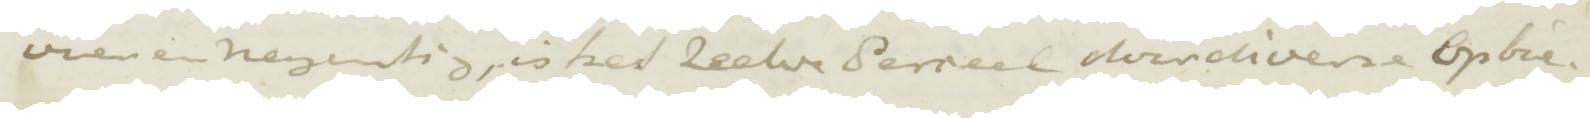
vier en negentig, is het Zelve Perceel door diverse Opbie„
